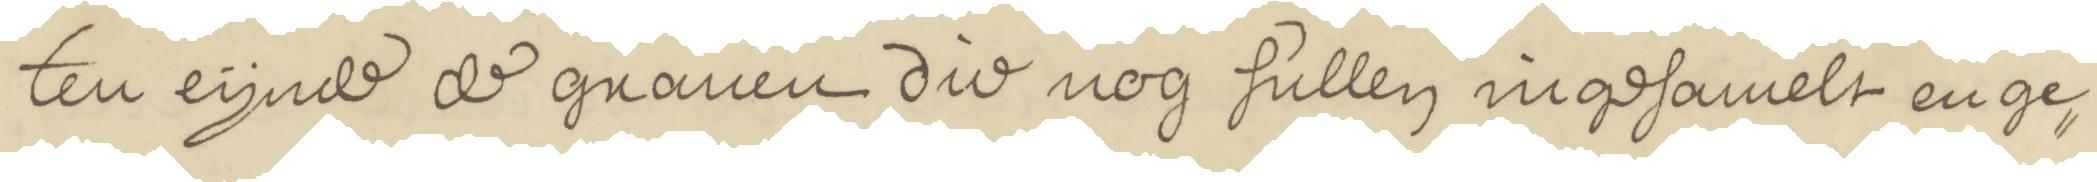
ten eijnde de granen die nog sullen ingesamelt en ge„
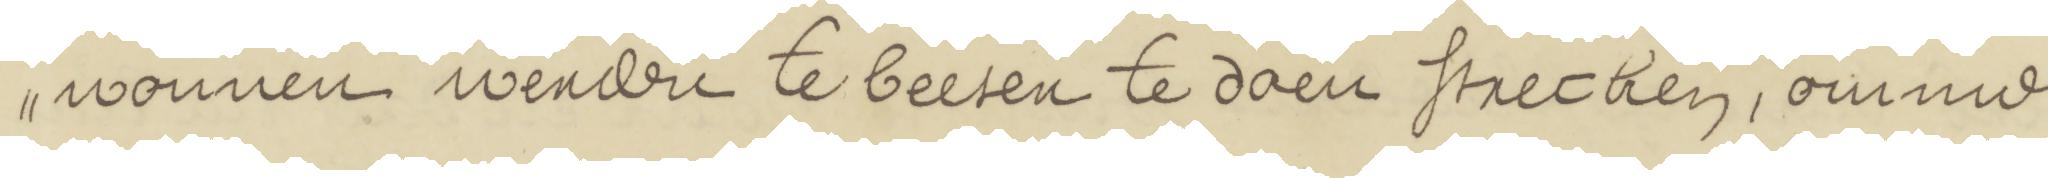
„wonnen werden te beeter te doen strecken, omme
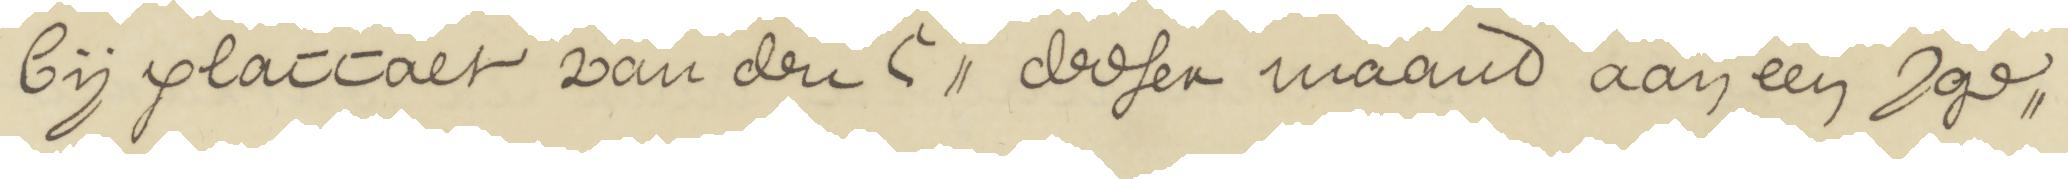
bij placcaet van den 5„' deeser maand aan een jge„
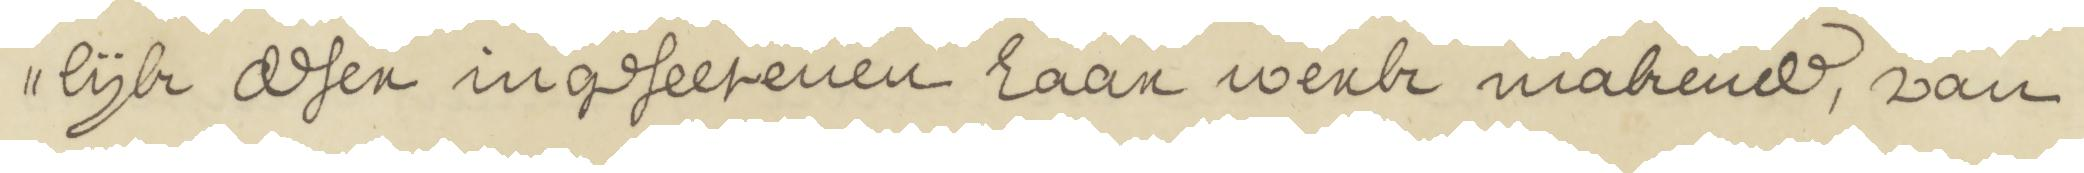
„lijk deser ingeseetenen haar werk makende, van
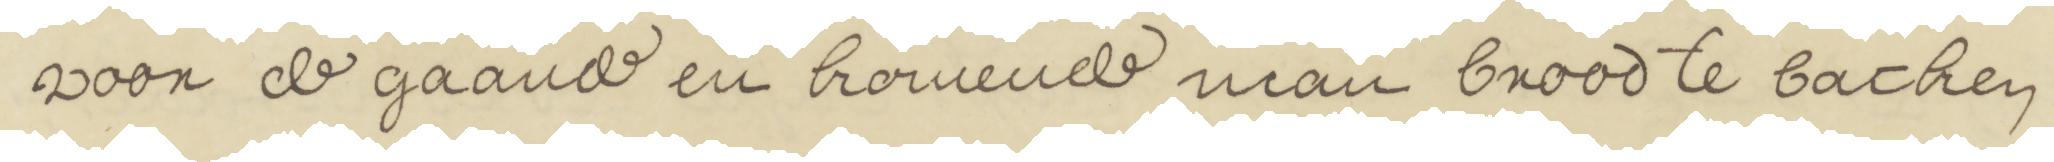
voor de gaande en komende man brood te backen
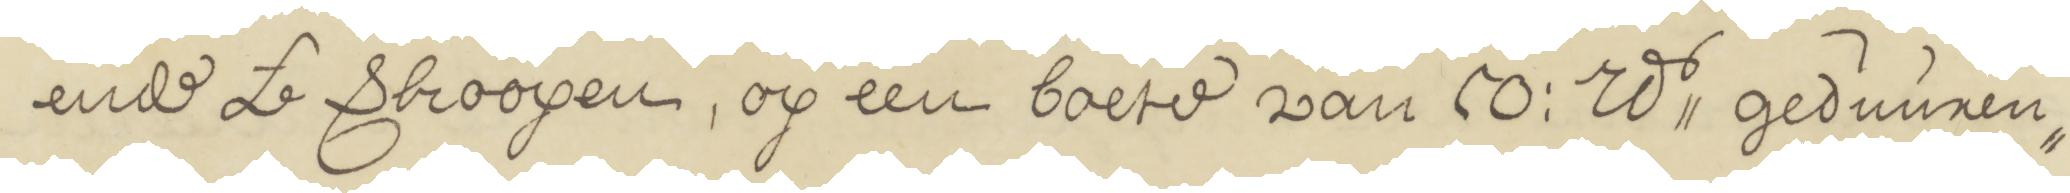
ende te verkoopen, op een boete van 50: rd„s geduuren„
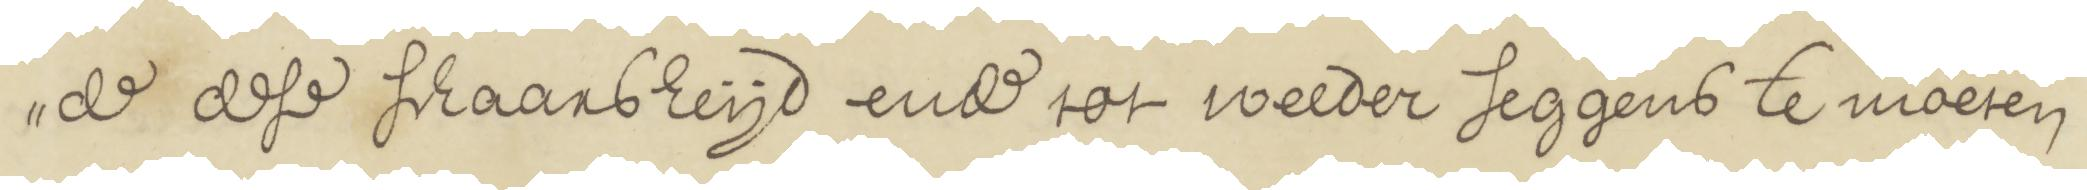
„de dese schaarsheijd ende tot weeder seggens te moeten
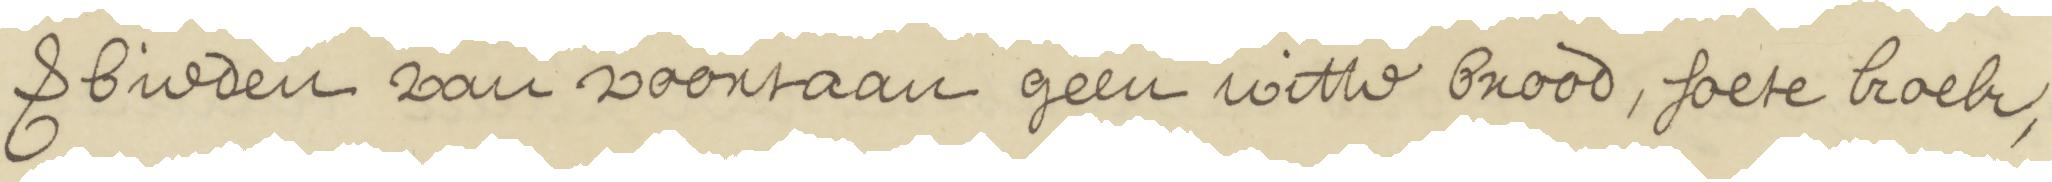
verbieden van voortaan geen witte brood, soete koek,
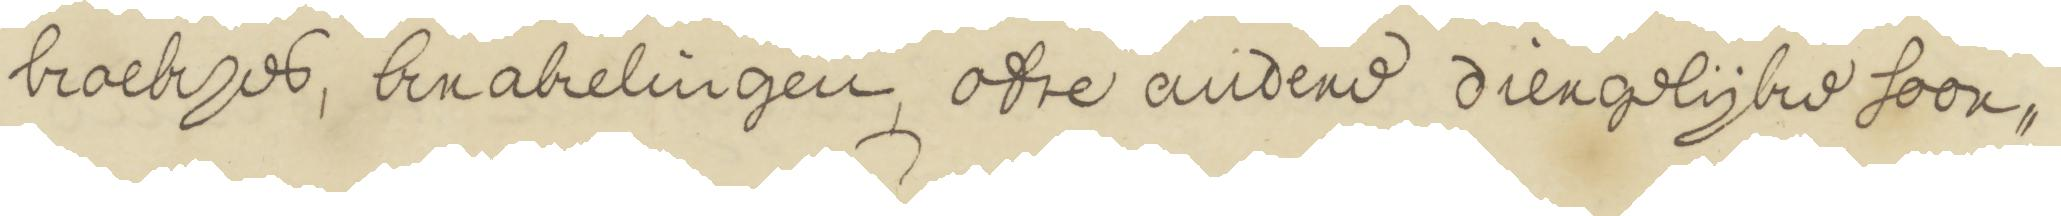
koekjes, krakelingen, ofte andere diergelijke soor„
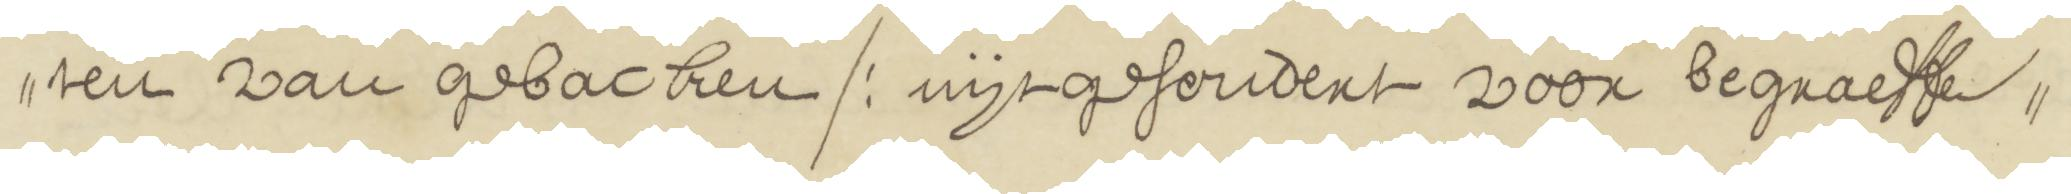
„ten van gebacken /: uijtgesondert voor begraeffe„
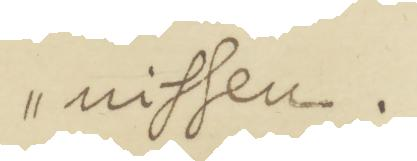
„nissen.
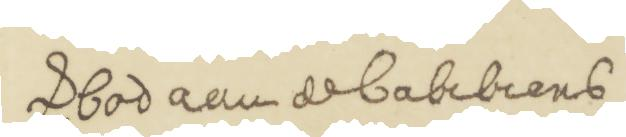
verbod aan de bakkers
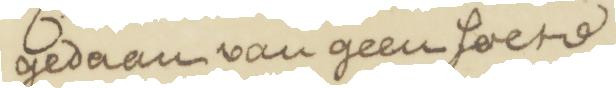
gedaan van geen soete
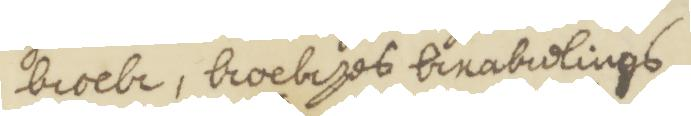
koek, koekjes krakelings
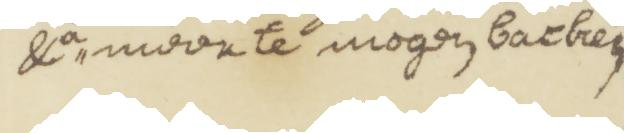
&„a meer te mogen backen
